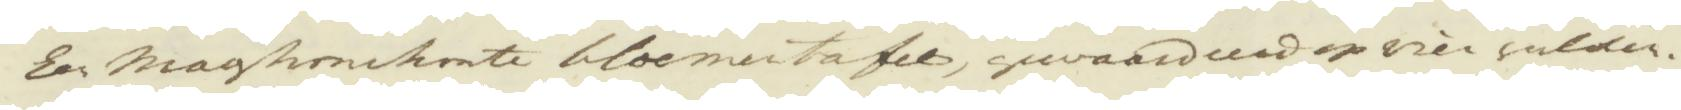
Een maghonihoute bloementafel, gewaardeerd op vier gulden
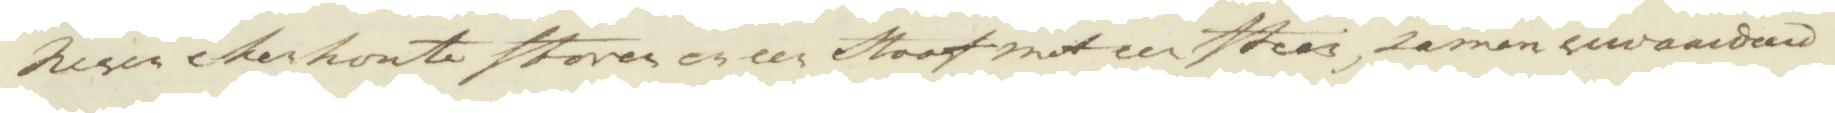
negen ekenhoute stoven en een stoof met een steen, zamen gewaardeerd
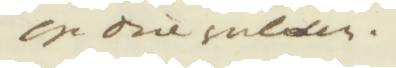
op drie gulden.
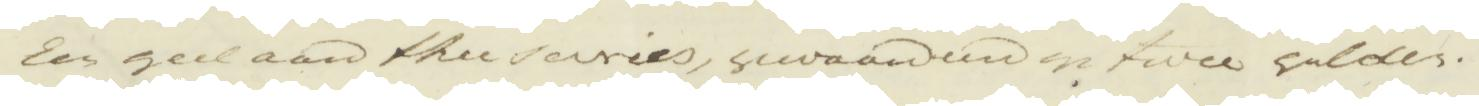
Een geel aard thee servies, gewaardeerd op twee gulden.
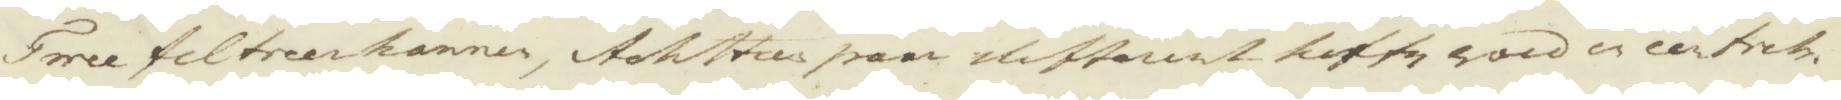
Twee filtreer kannen, Achttien paar different koffy goed en een trek.
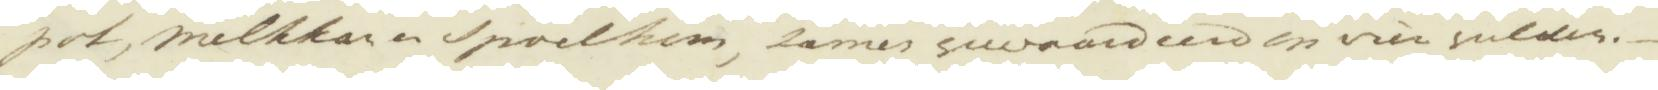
pot, melkken en spoelkom, zamen gewaardeerd op vier gulden.
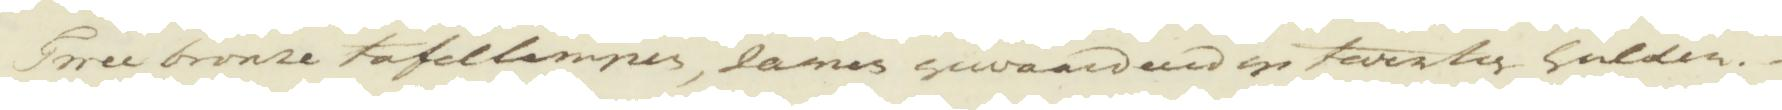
Twee bronze tafellampen, zamen gewaardeerd op twintig Gulden.
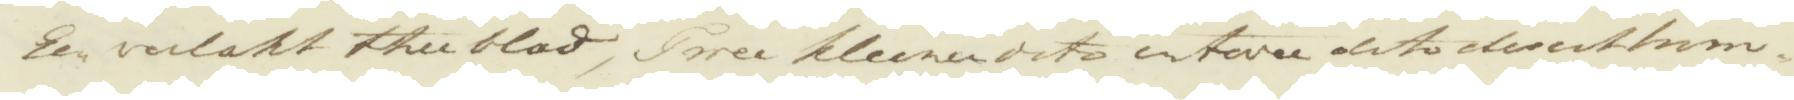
Een verlakt thee blad, Twee kleinen dito en twee dito deserttrom
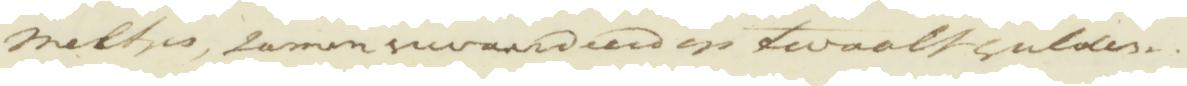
meltjes, zamen gewaarderd op twaalf gulden.
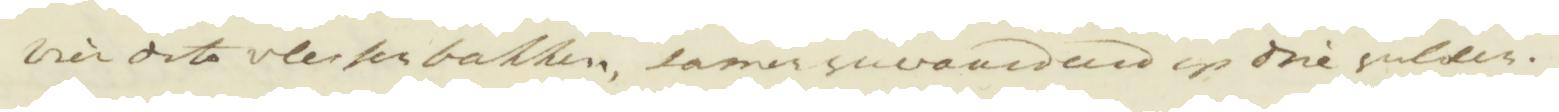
vier dito vlessen bakken, samen gewaardeerd op drie gulden.
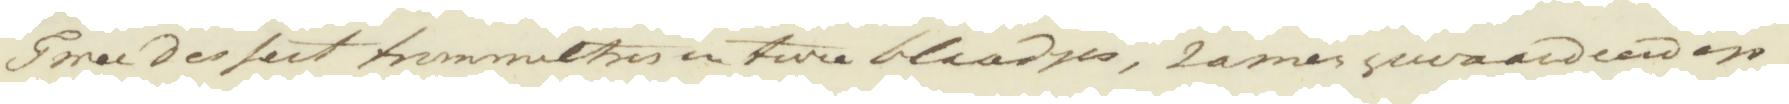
Twee dessert trommeltjes en twee blaadjes, zamen gewaardeerd op
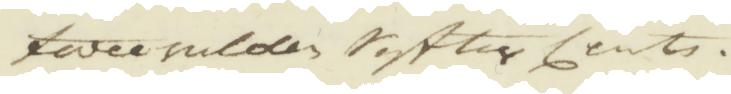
twee gulden Vyftig Cents
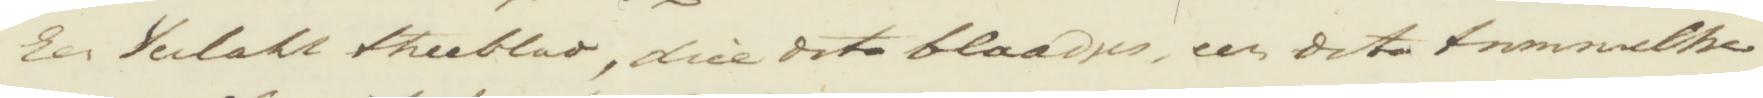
Een Verlakt theeblad, drie dito blaadjes, een dito trommeltje
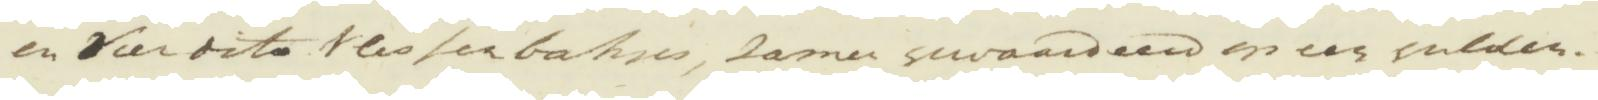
en Vier dito Vlessen bakjes, zamen gewaardeerd op een gulden.
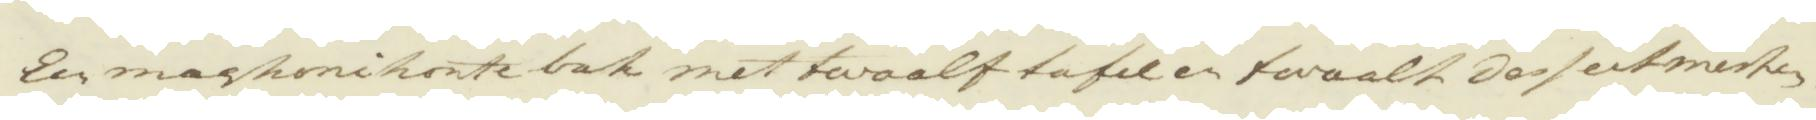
Een maghonihoute bak met twaalf tafel en twaalf dessertmessen
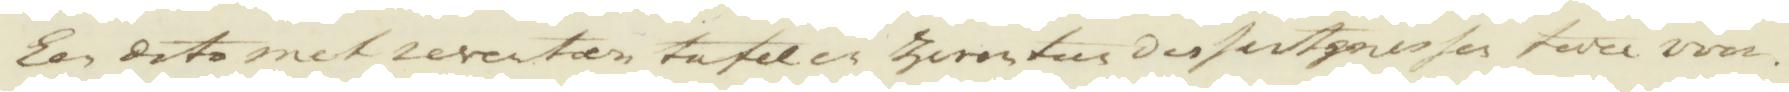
Een dito met zeventien tafel en zeventien dessert messen messen twee voor
